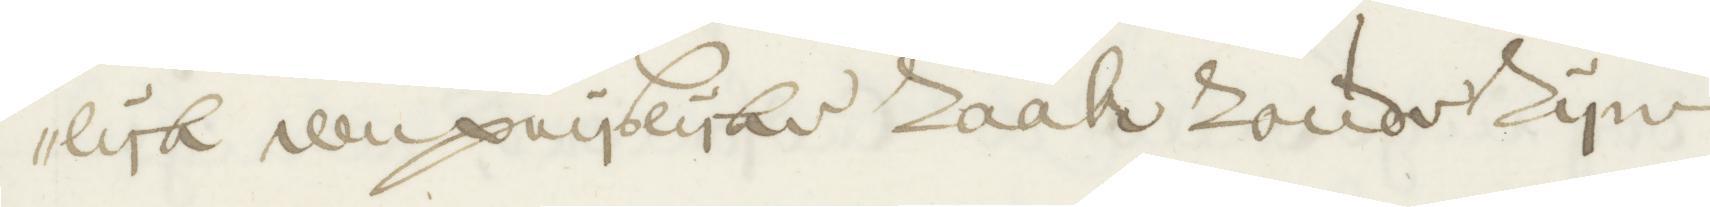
„lijk een prijslijke zaak zoude zijn
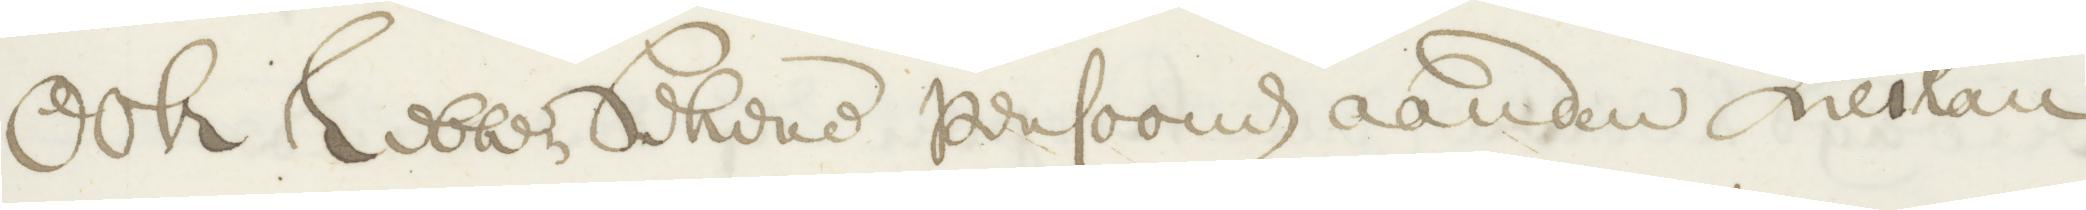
Ook hebben sekere persoonen aan den sulthan
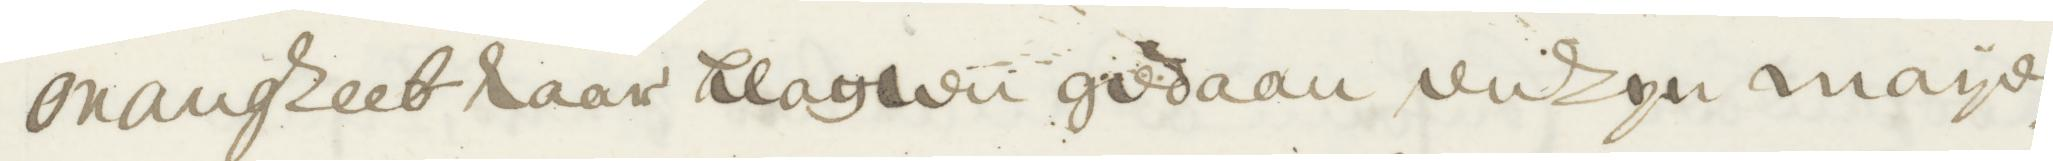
orangzeeb haar klagten gedaan en zijn maije„
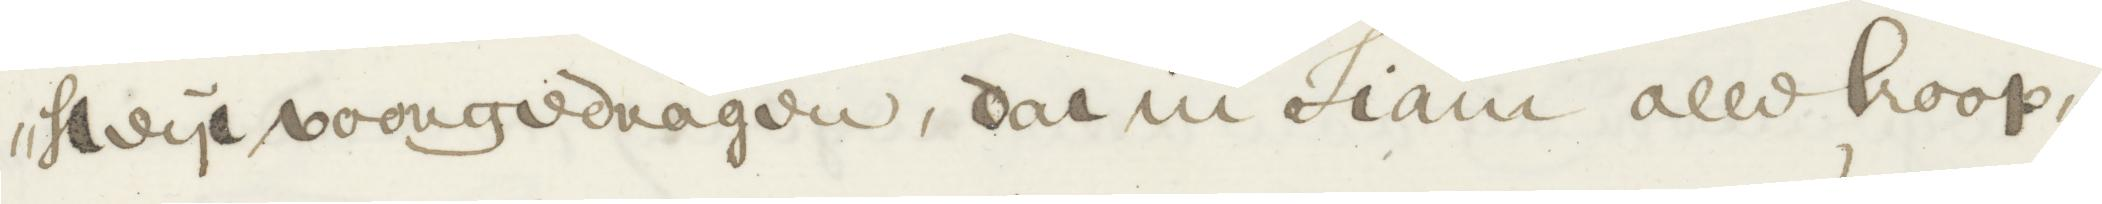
„steijt voorgedragen, dat in siam alle koop„
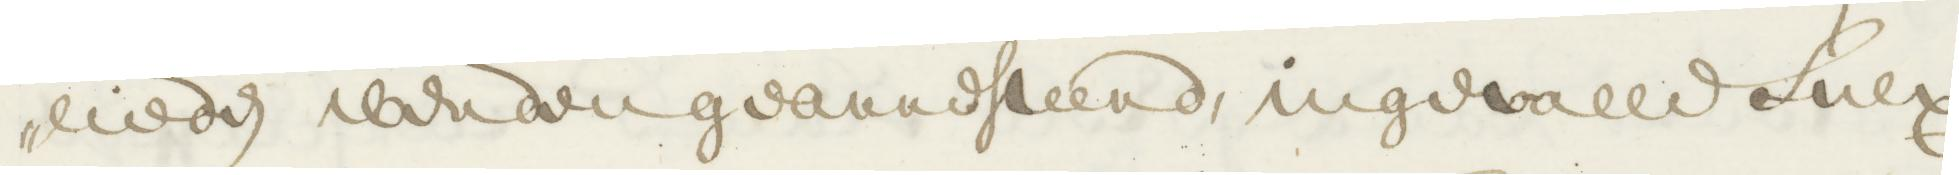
„lieden werden gearresteerd, ingevalle sulx
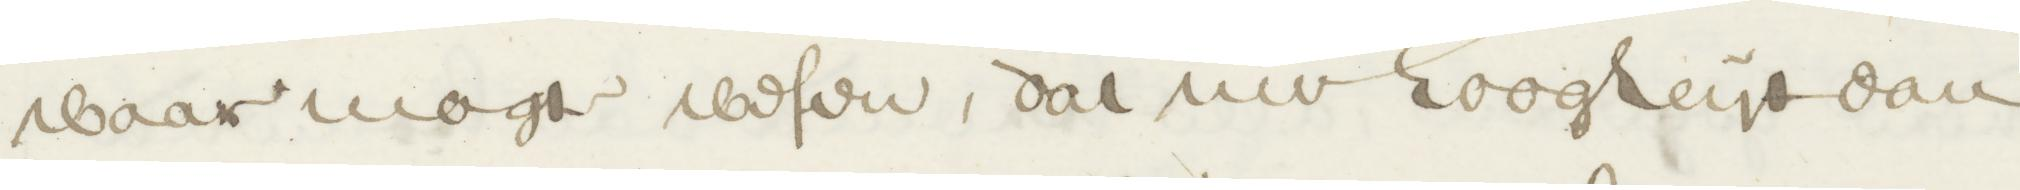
waar mogte wesen, dat uw hoogheijt dan
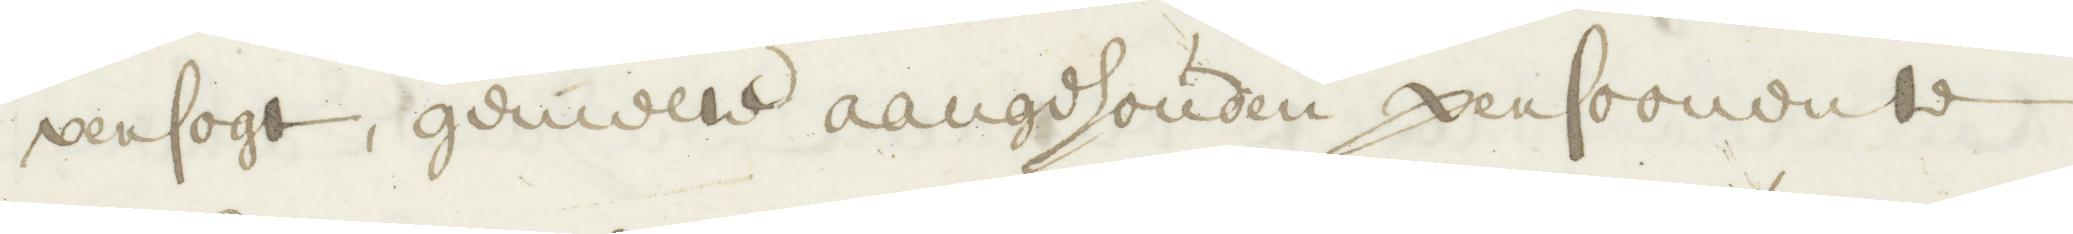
versogt, gemelte aangehouden persoonen te
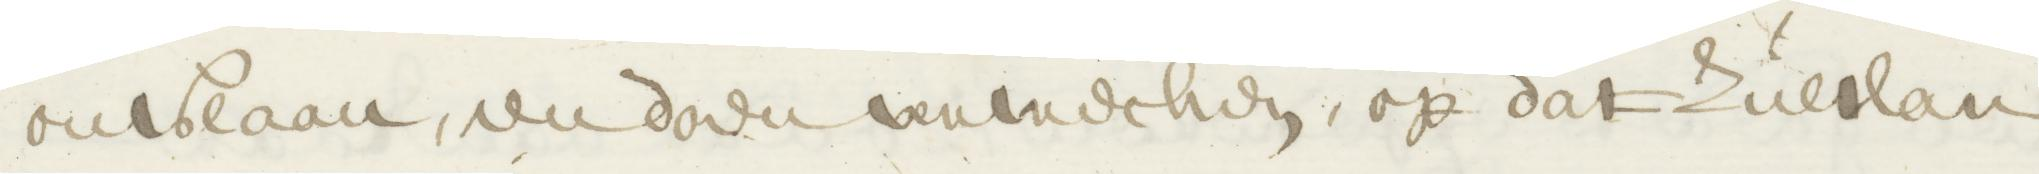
ontslaan, en doen vertrecken, op dat zulthan
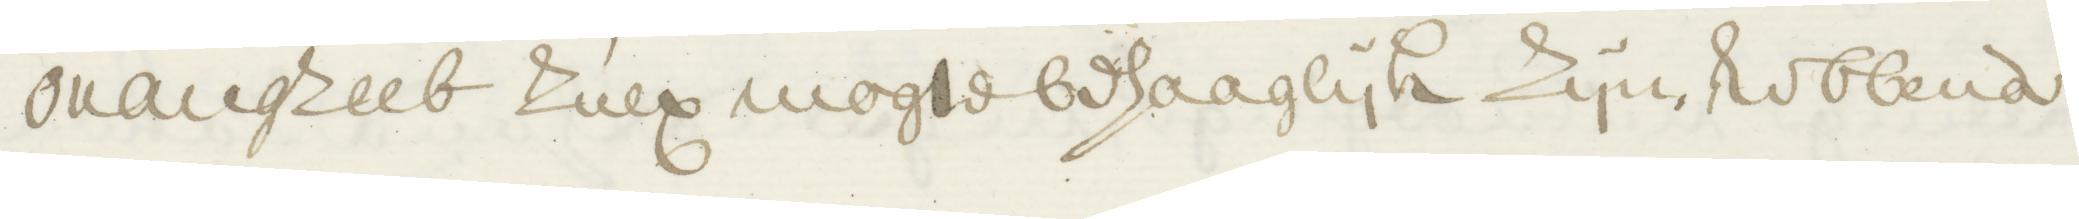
orangzeeb zulx mogte behaaglijk zijn, hebbende
